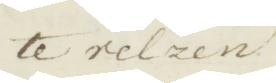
te velzen
